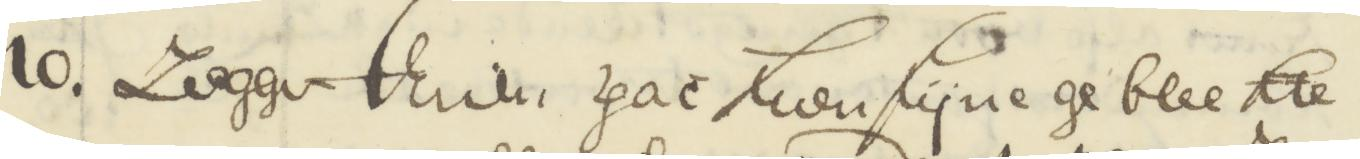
10. zegge thien packen fijne gebleekte
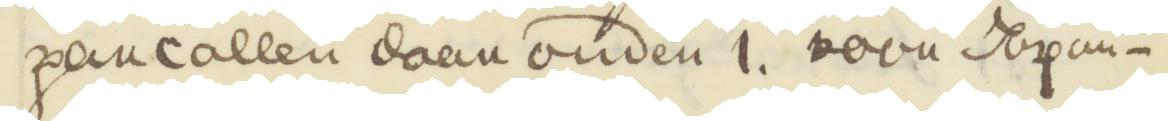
parcallen daar onden 1. voor Iapan-
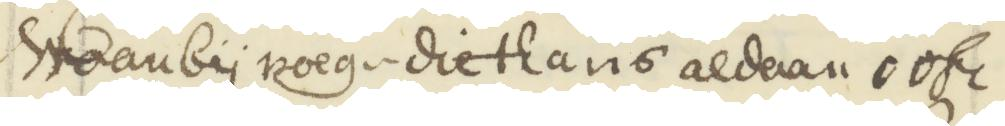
Waarbij voege diethans aldaar ook
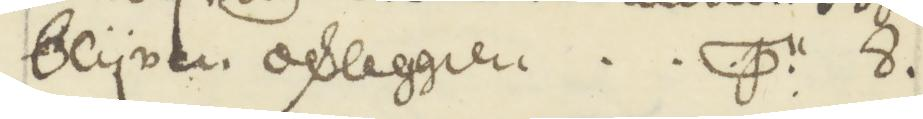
blijven overleggen - - - p:n 8.
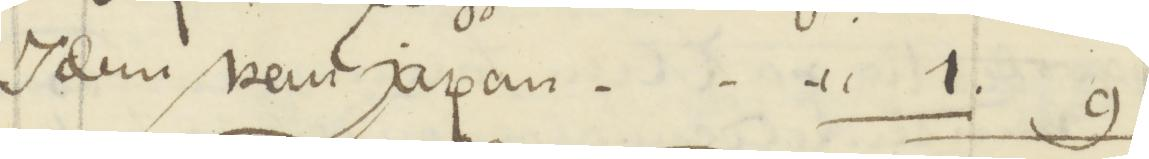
Idem van japan - - -„ 1. 9
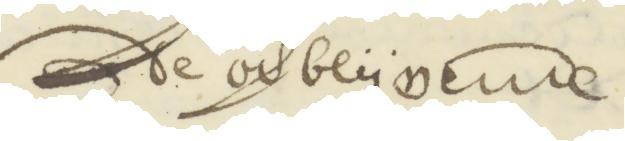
de overblijvende
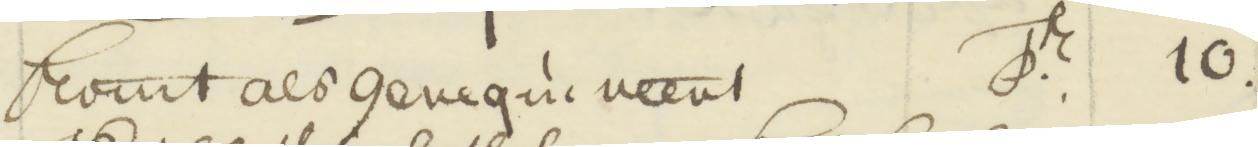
komt als gerequireert p:k 10.
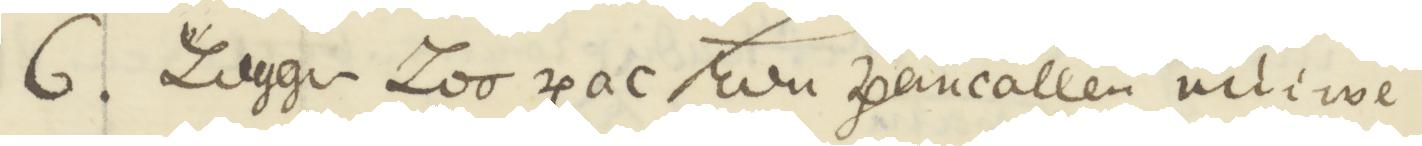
6. zegge zes packen pancallen ruiwe
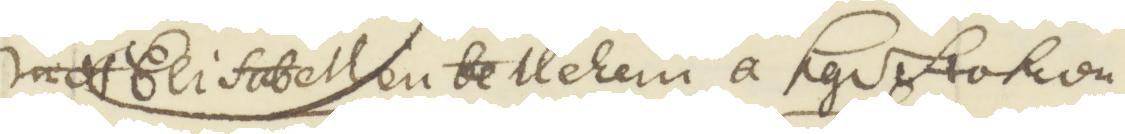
met Elisabeth en betlehem a fgestoken
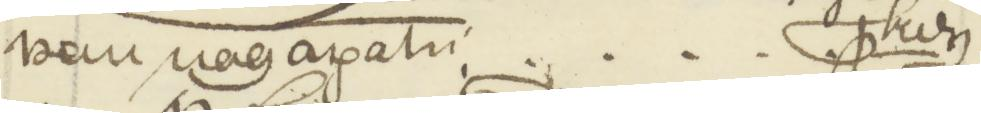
van nagapatn: - - - - - p=ken2
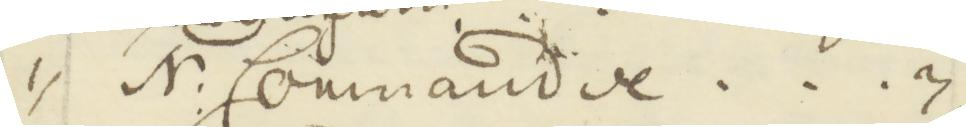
„ N: Cormandel - - - 3
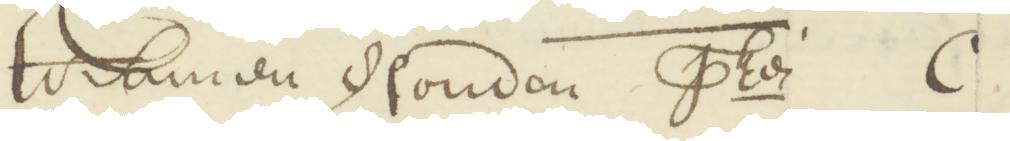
te samen versonden p-ken 5
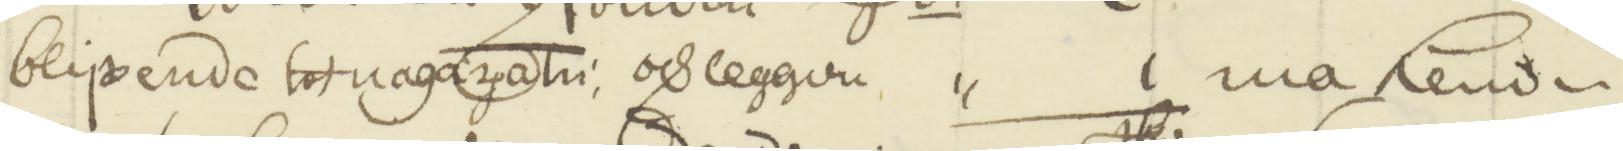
blijvende tot nagapatn: overleggen „ 1 makende
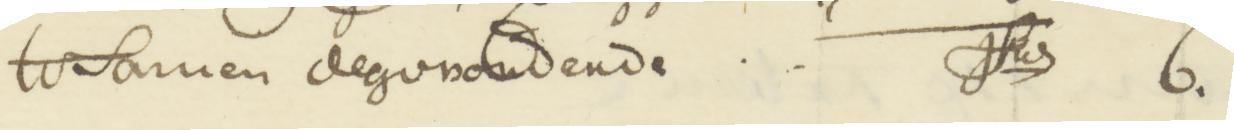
te samen degevorderde - - pken 6.
